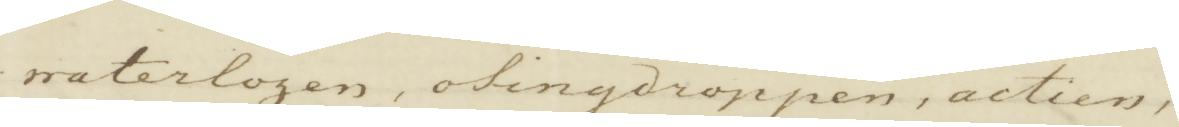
waterlozen, osingdroppen, actien,
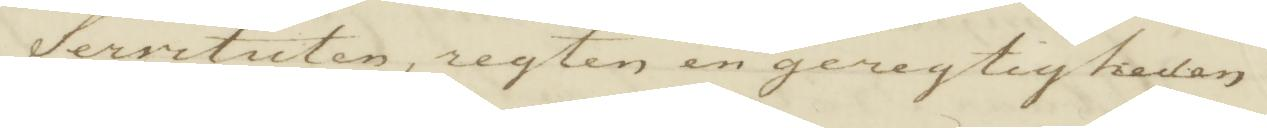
Servituten, regten en geregtigheden
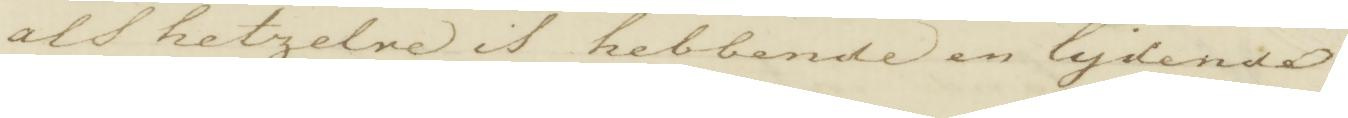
als hetzelve is hebbende en lydende
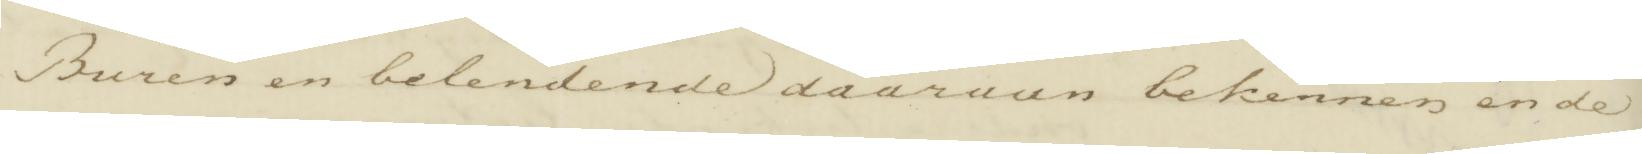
Buren en belendende daaraan bekennen en de
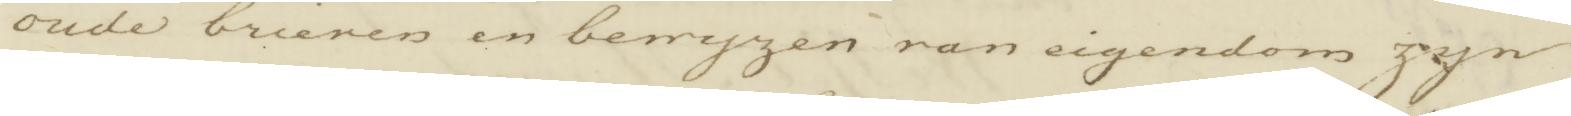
oude brieven en bewyzen van eigendom zyn
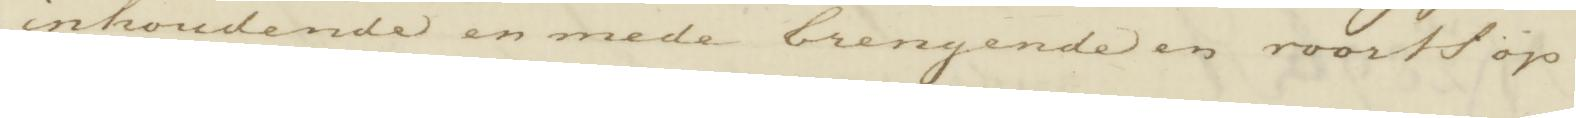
inhoudende en mede brengende en voorts op
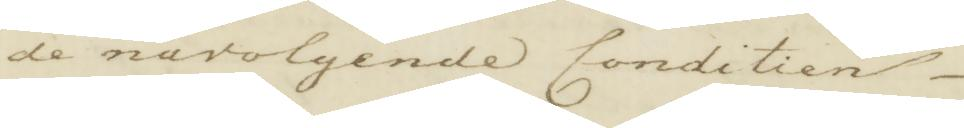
de navolgende Conditien-
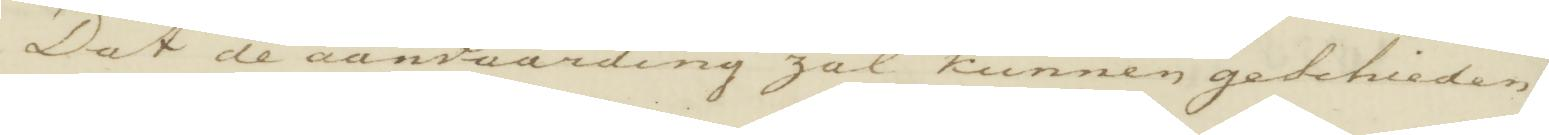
Dat de aanvaarding zal kunnen geschieden
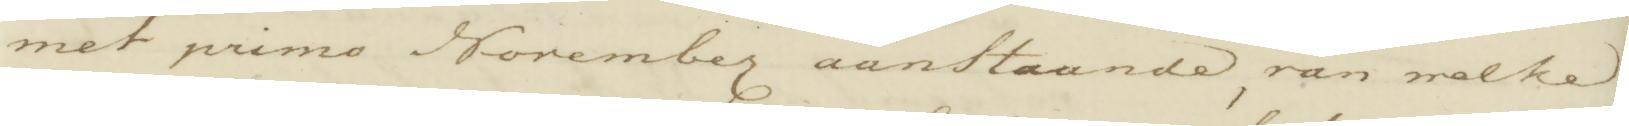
met primo November aanstaande, van welke
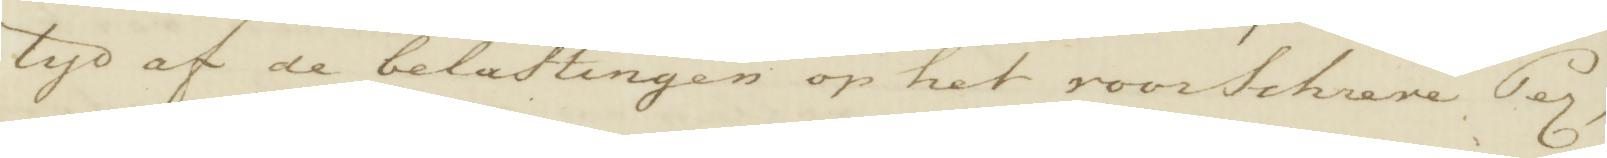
tyd af de belastingen op het voorschreve Per,
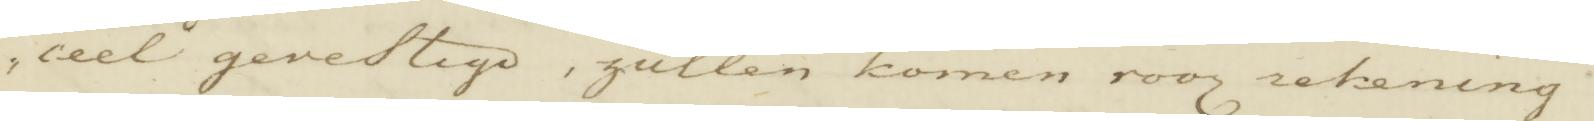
„ceel gevestigd, zullen komen voor rekening
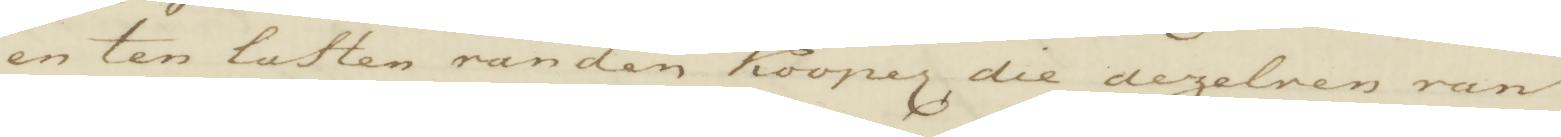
en ten lasten van den Kooper die dezelven van
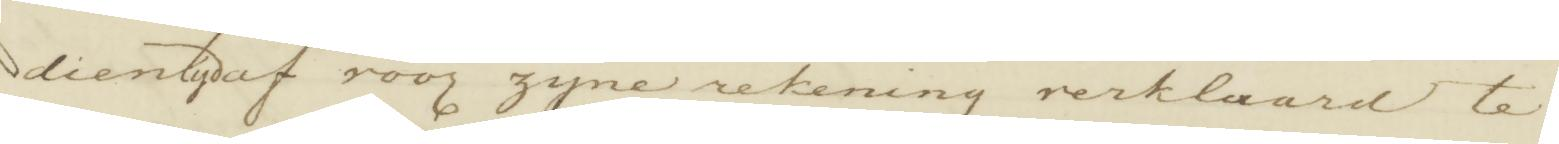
dien tyd af voor zyne rekening verklaard te
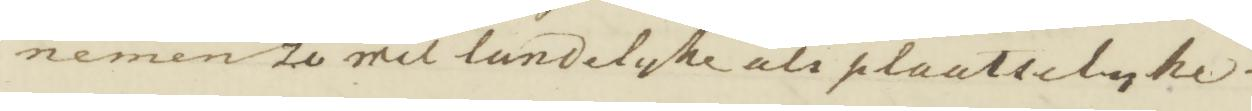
nemen zo wel landelyke als plaatselyke.
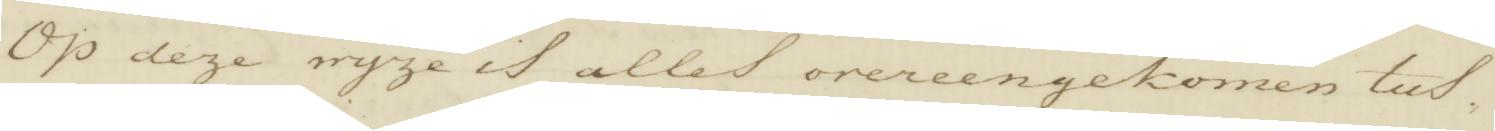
Op deze wyze is alles overeengekomen tus„
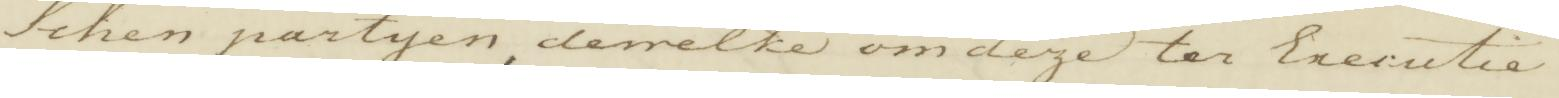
Schen partyen dewelke om deze ter Executie
